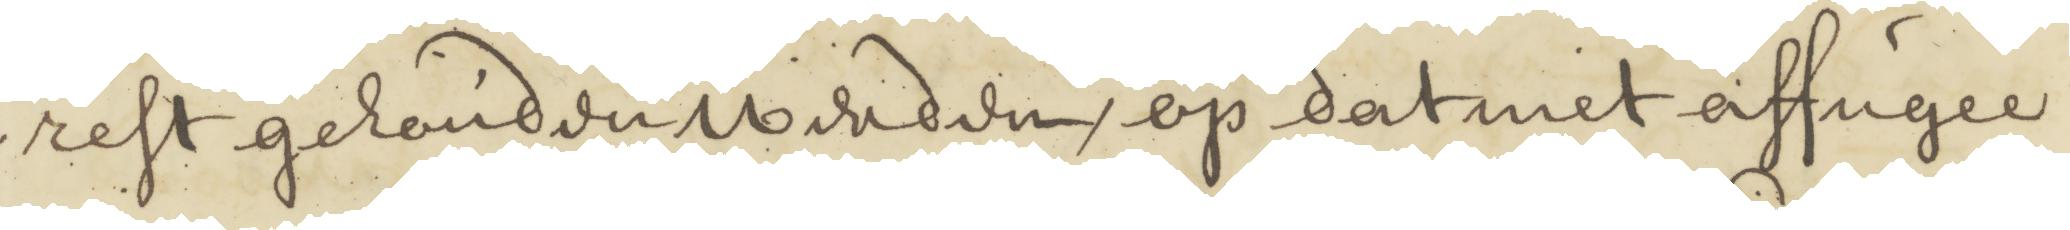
rest gehouden werden, op dat niet affugee
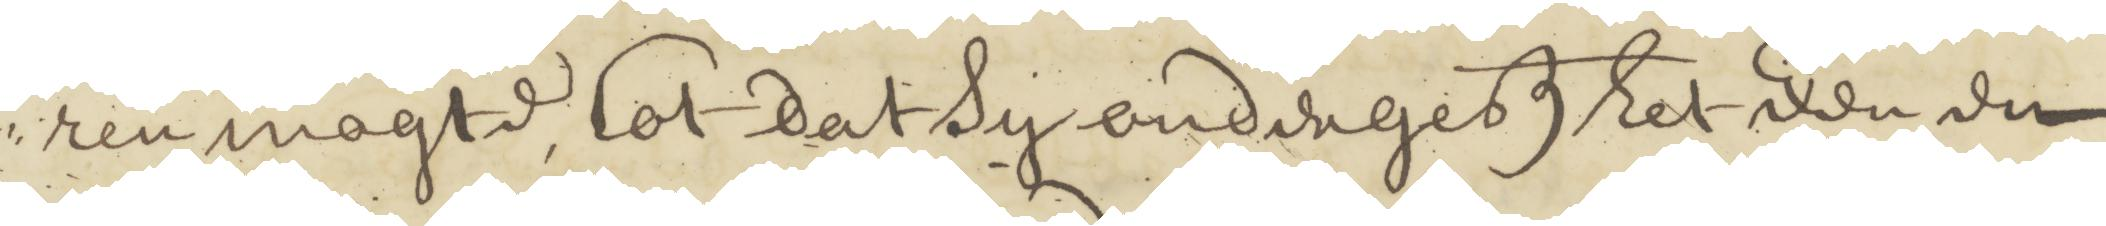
,ren mogte, tot dat Sij onderges het Een en
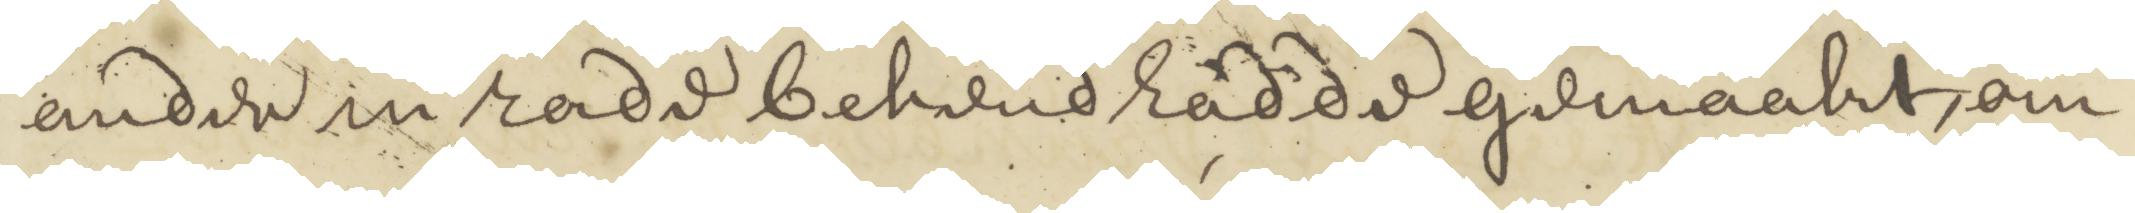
ander in rade bekend hadde gemaakt, om
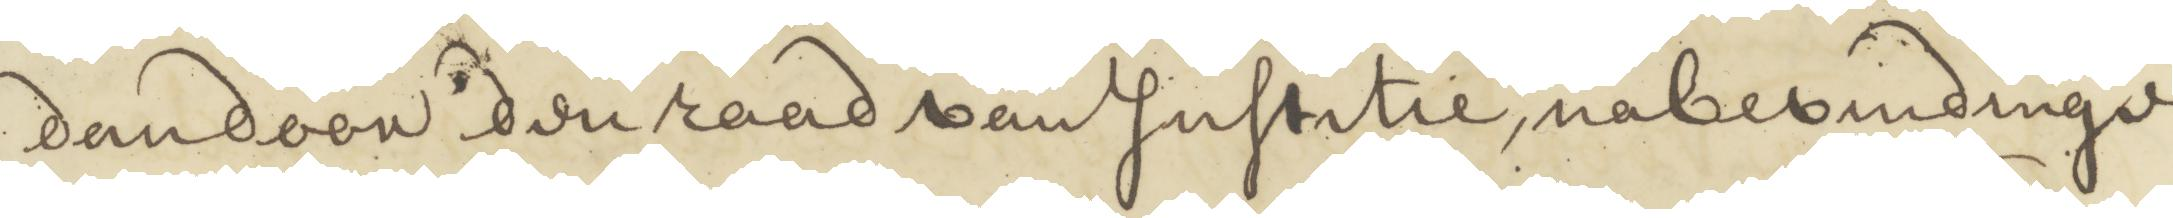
dan door den raad van Justitie, na bevindinge
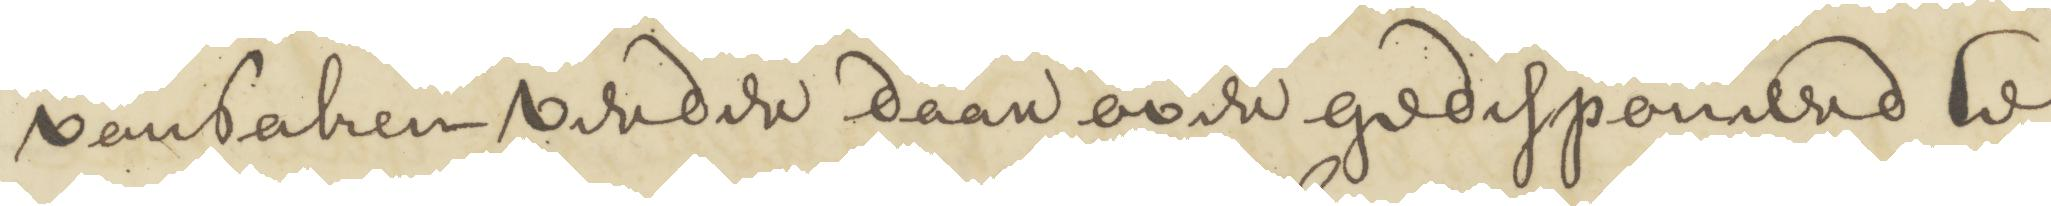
van saken verder daar over gedisponeerd te
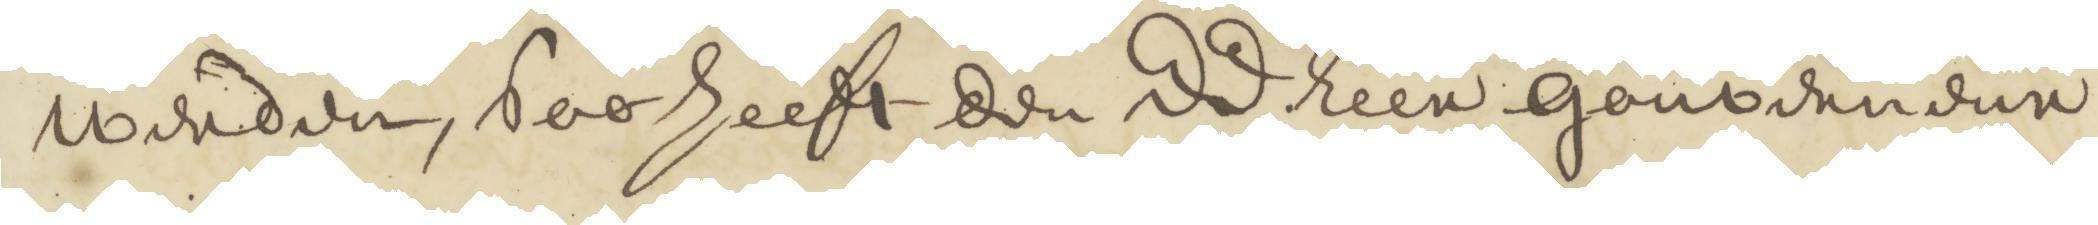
werden, soo heeft den EE. heer gouverneur
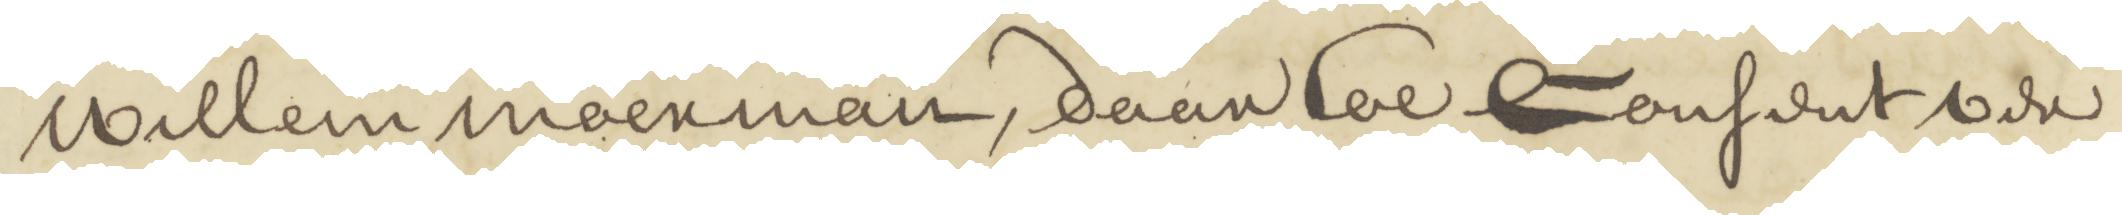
willem moerman, daar toe Consent ver
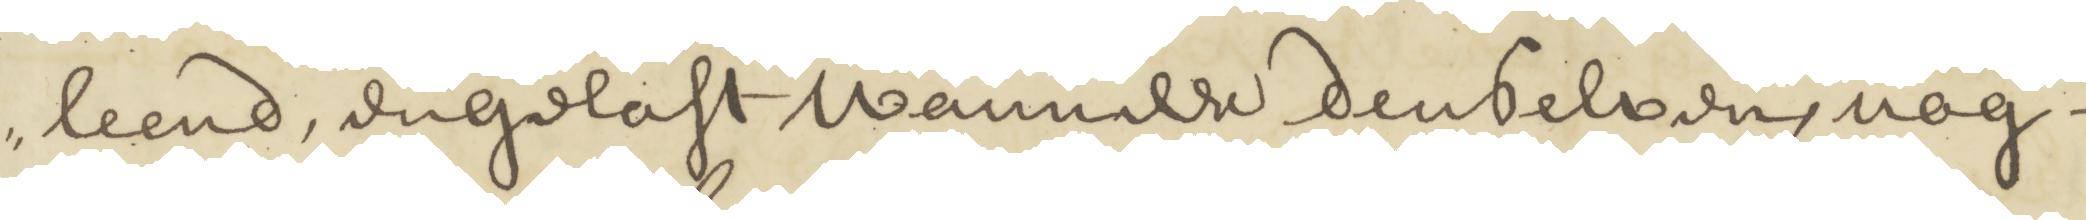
leend, en gelast wanneer denselven, nog
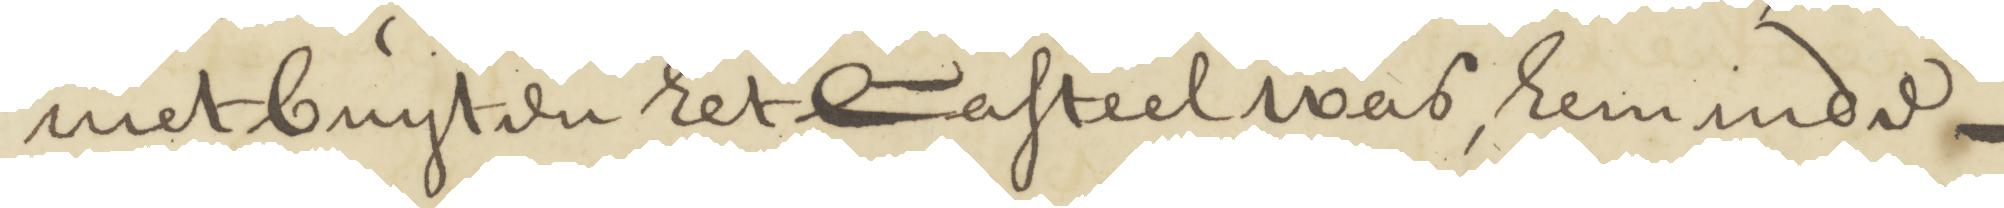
niet buijten het Casteel was, hem in de —
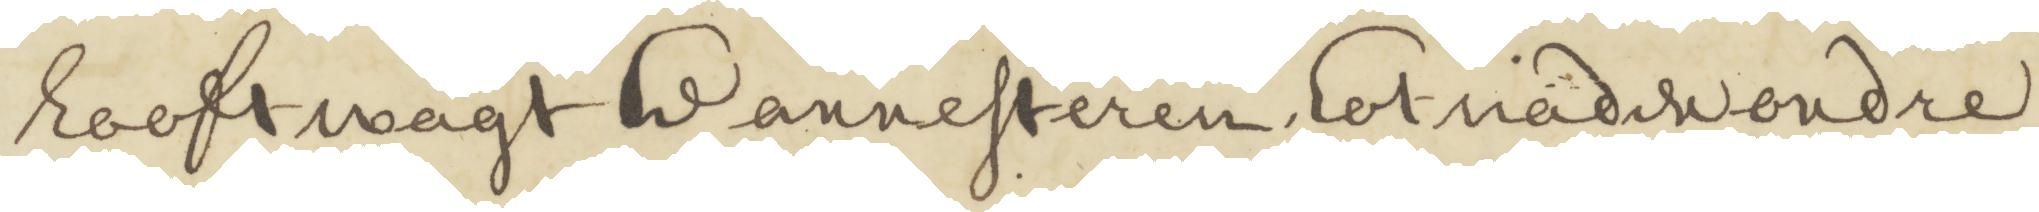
hooft wagt te arresteren, tot nader ordre
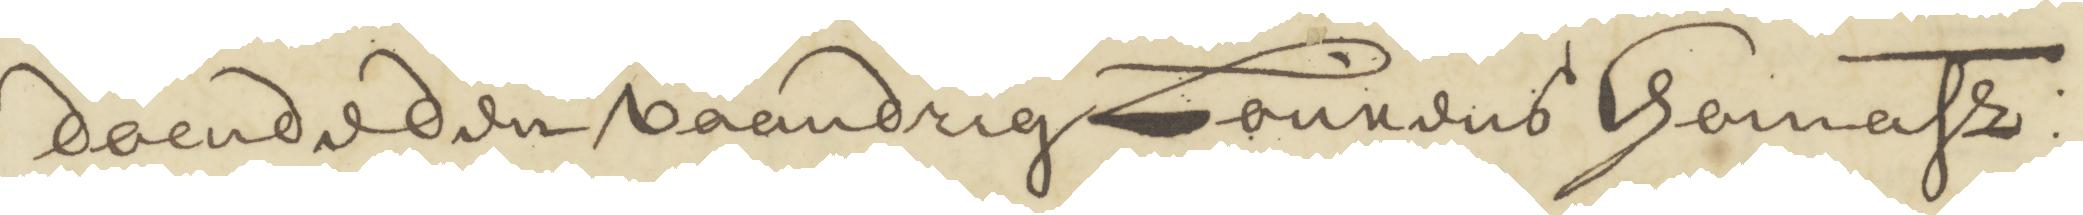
doende den vaandrig Lourens thomasz:
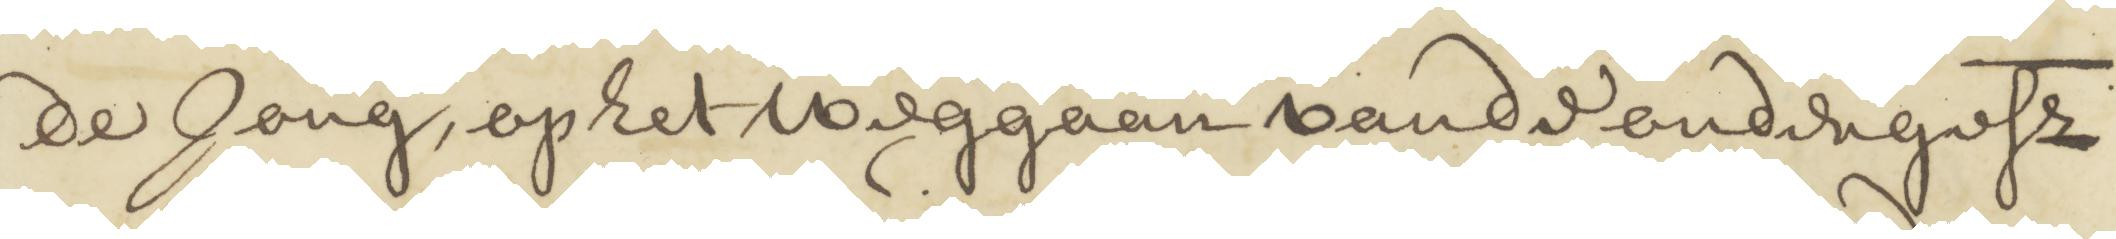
de Jong, op het weggaan vande ondergesz
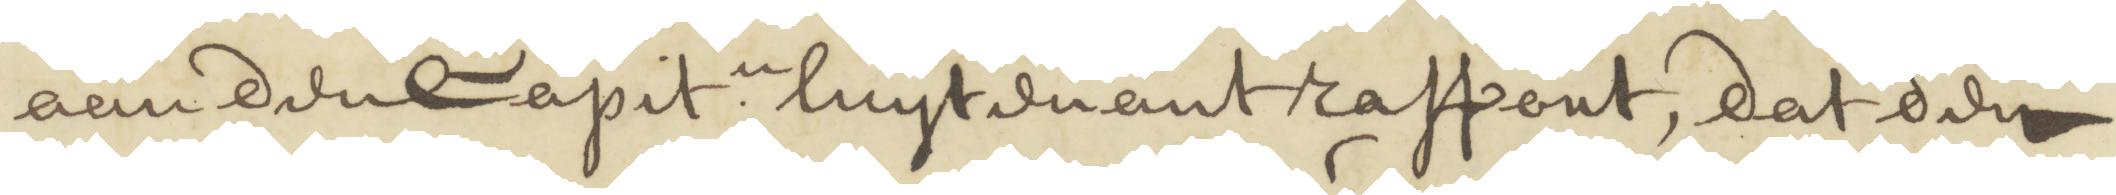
aan den Capit:n luijtenant rapport, dat den
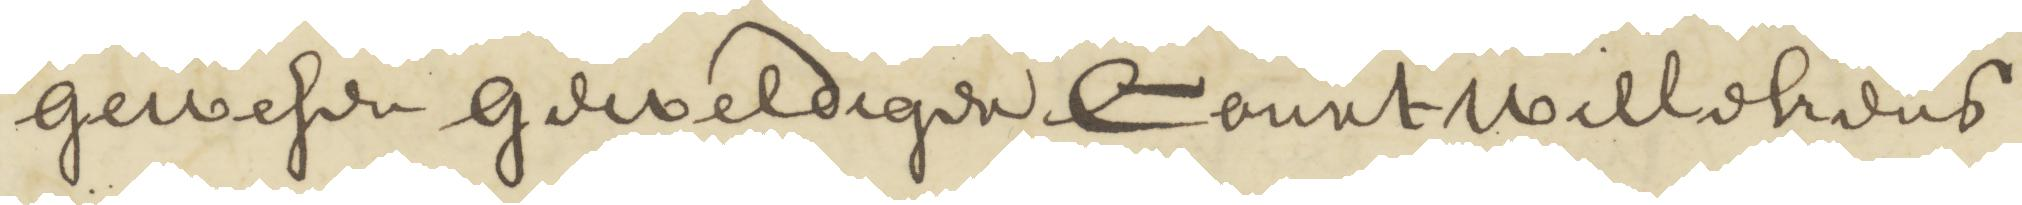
gewesen geweldiger Court willekens
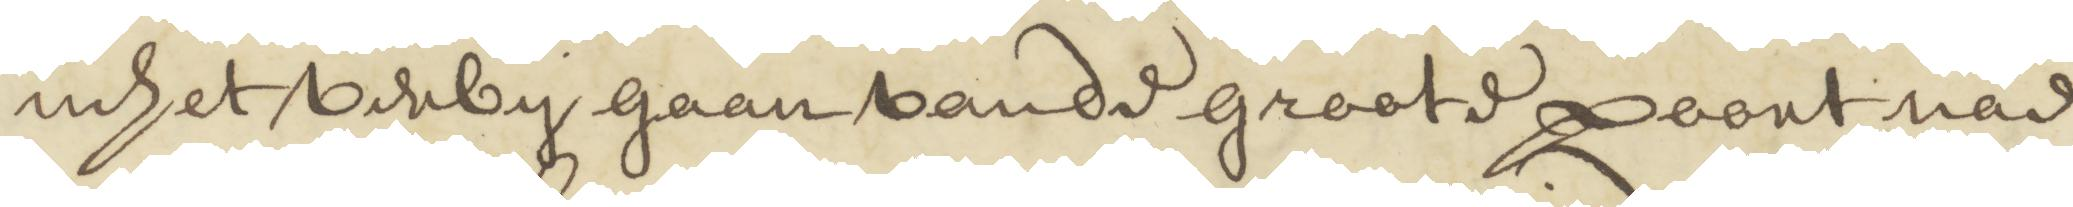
in het verbij gaan vande groote poort na
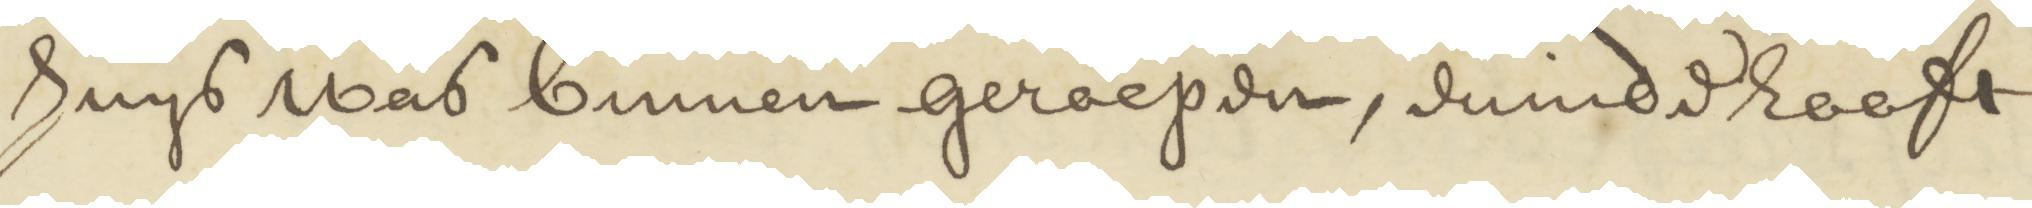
huys was binnen geroepen, en in de hooft
